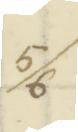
5/6
